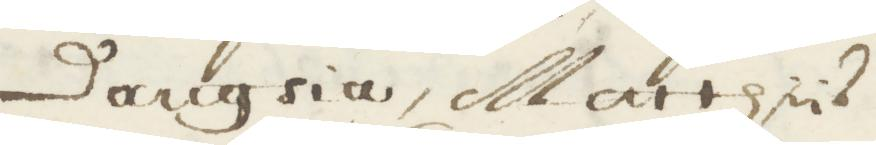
Dangsia, Matthijs
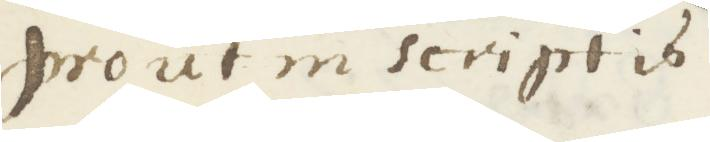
Pro ut in scriptis
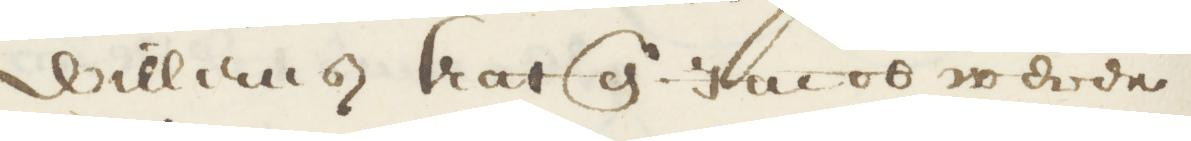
Willems kat ende Iacob wever
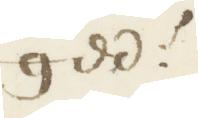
ged:
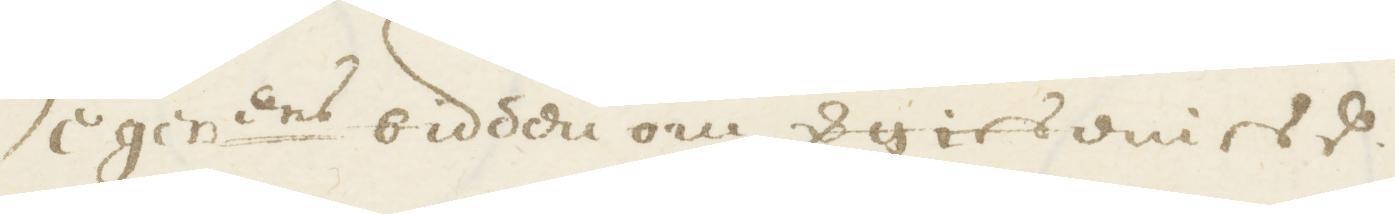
De gev=ens bidden om vergiffenisse.
